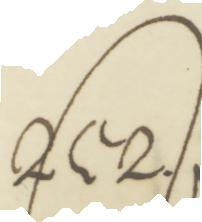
252.
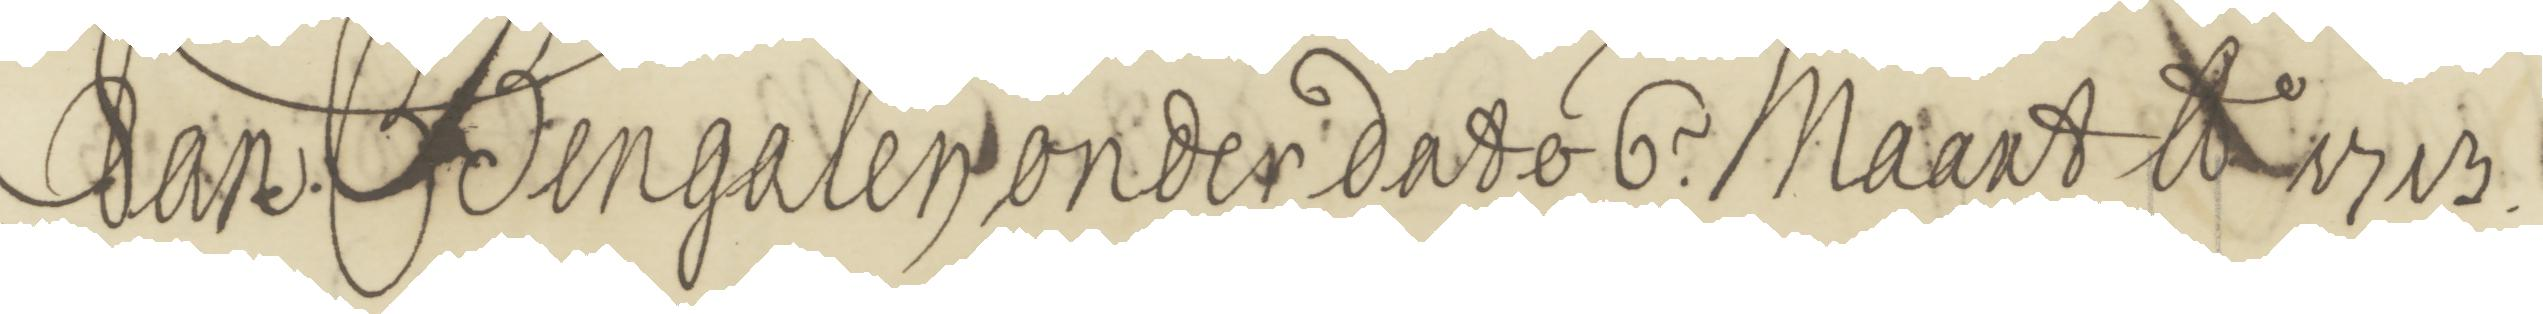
Van Bengalen onder dato 6.' Maart Ao 1713.
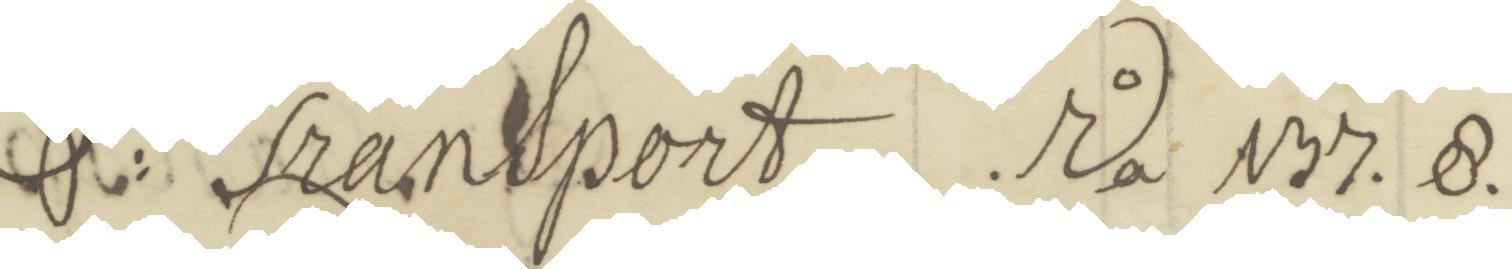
P:r Transport - - - Roa 137. 8.
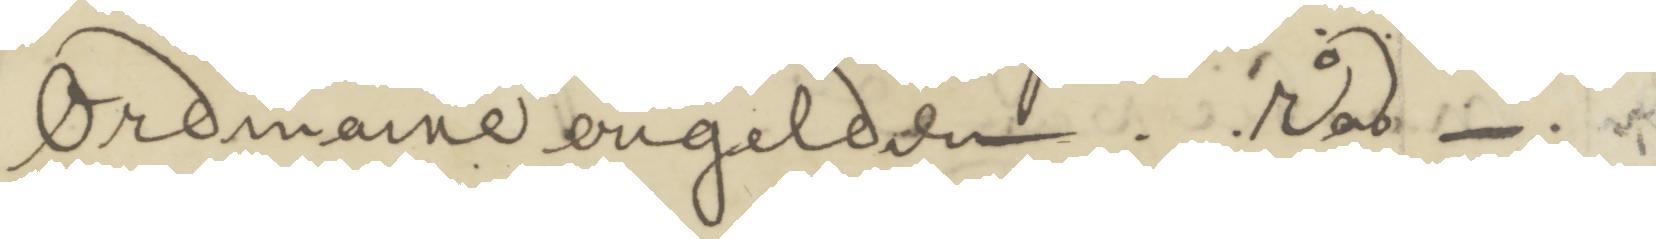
Ordinaire ongelden - - Roas — .
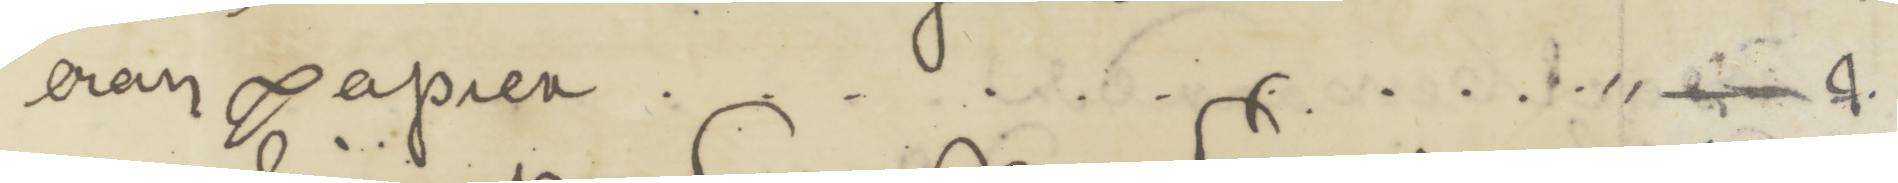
aan papier - - - - - - - - - - - - „ — 4.
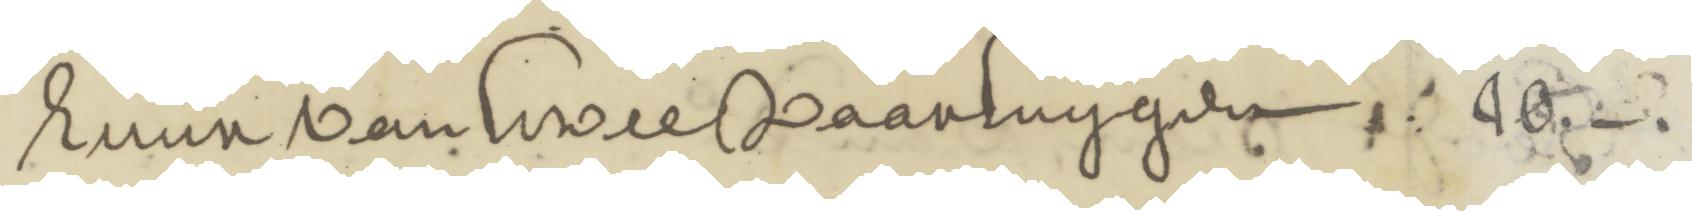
huur van twee vaartuygen - „ 40. —.
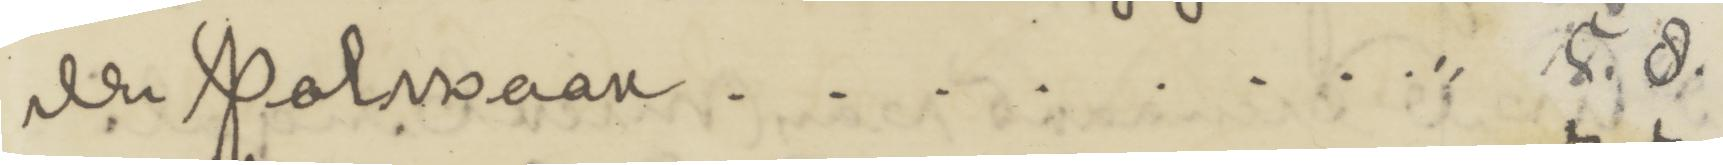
een Polwaar - - - - - - - - „ 5. 8.
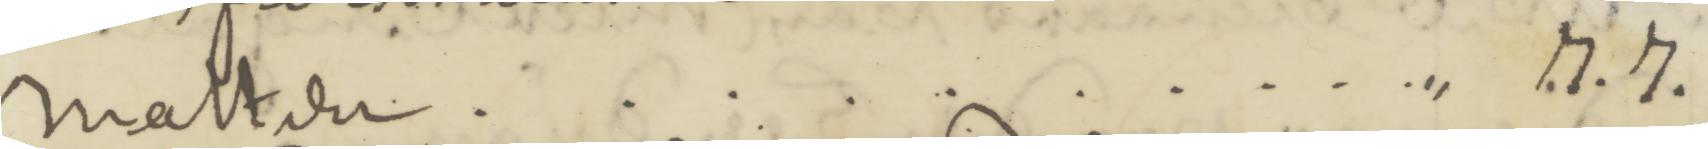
matten - - - - - - - - - - „ 7. 7.
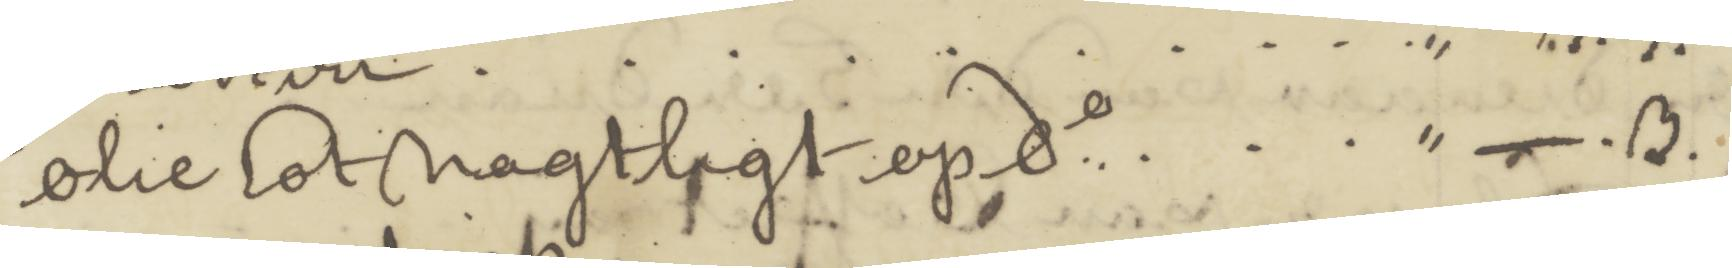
olie tot nagtligt op d„o - - - „ —. 3.
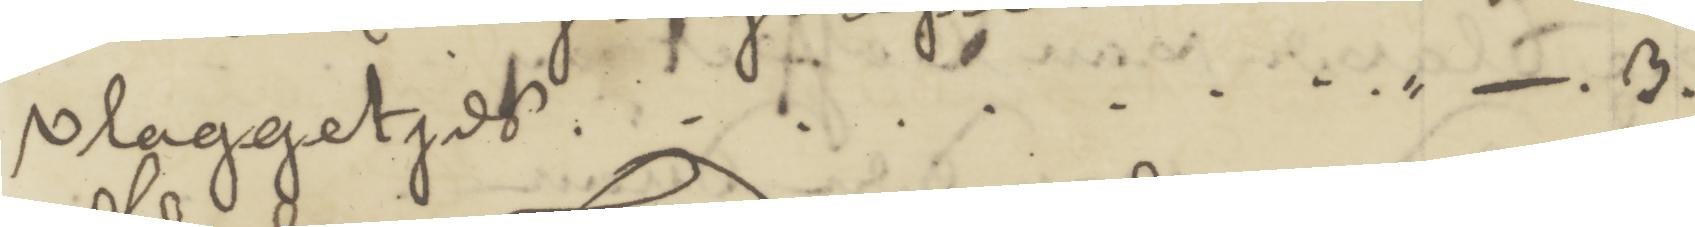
vlaggetjes - - - - - - - - - „ —. 3
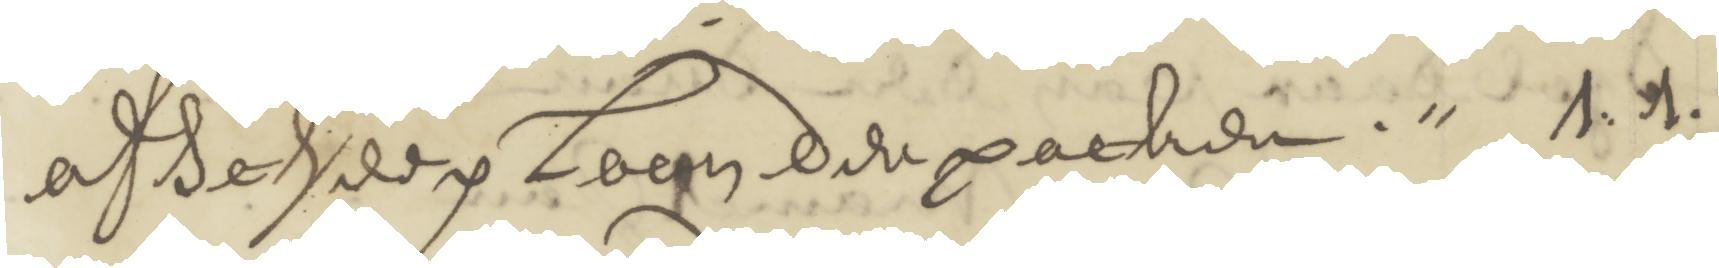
afscheep Loon der packen - „ 1. 1.
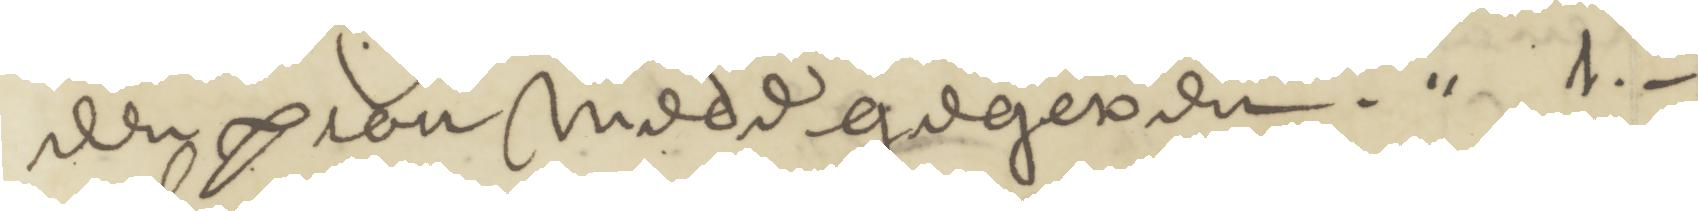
een pion mede gegeven - „ 1. —
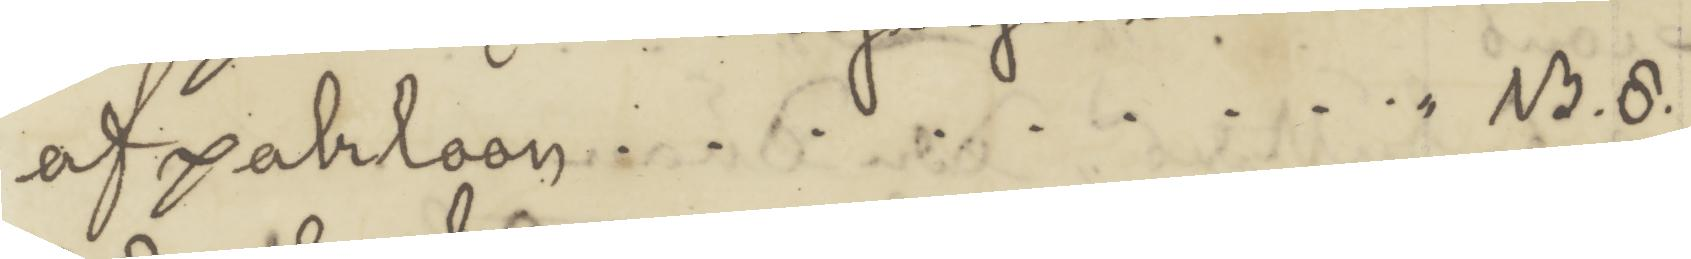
afpakloon - - - - - - - - - „ 13. 8.
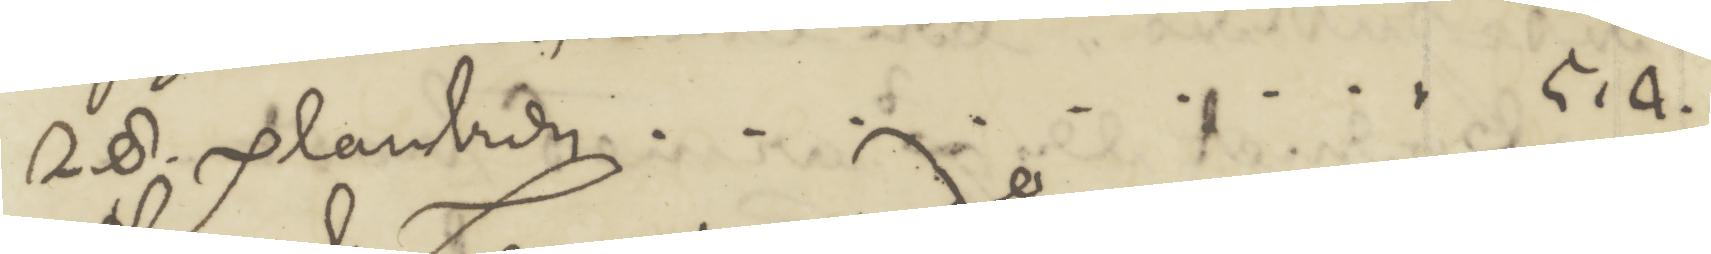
28. planken - - - - - - - - „ 5.4.
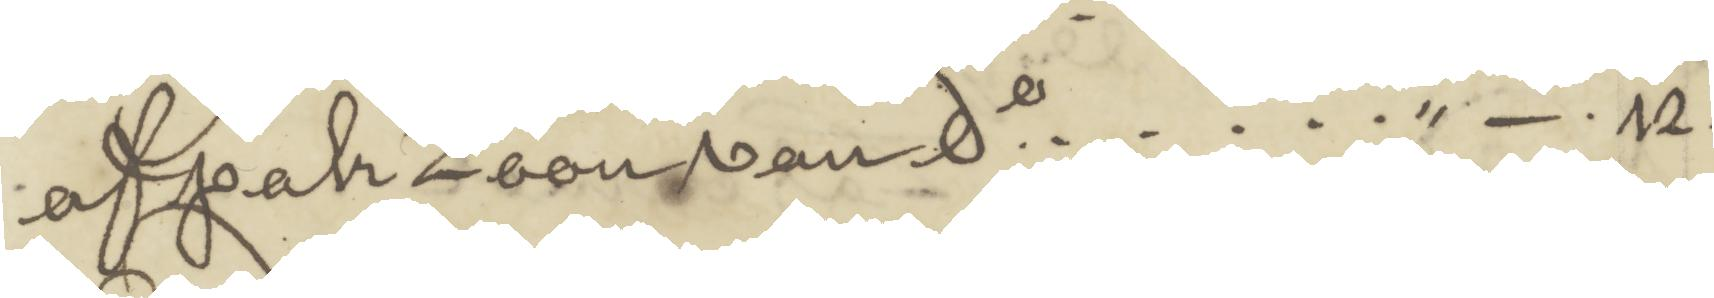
afpak Loon van d.o - - - - - „ —. 12
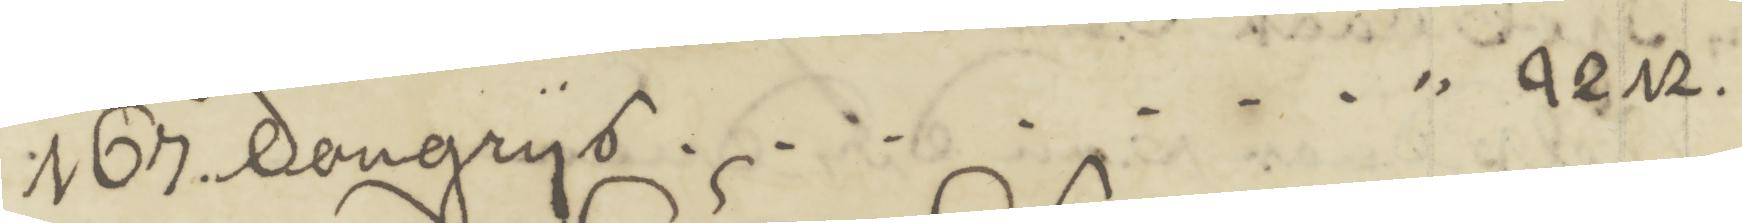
167. dongrijs - - - - - - - „ 4212.
